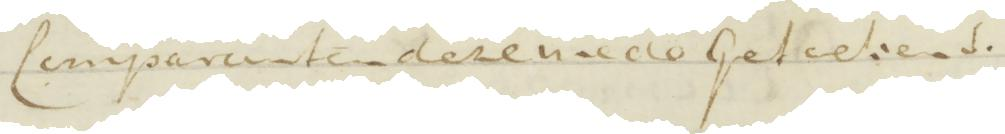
Comparanten deze mede Getekend.
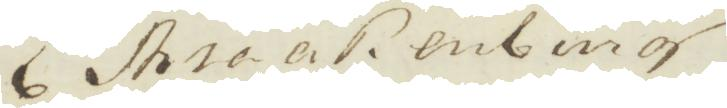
E Staakenling
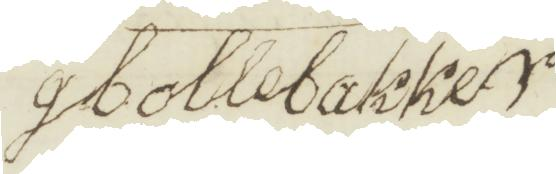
g bollebakker
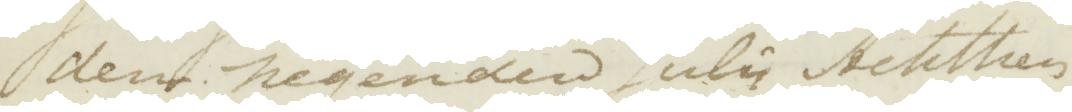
den negenden julij Achttien
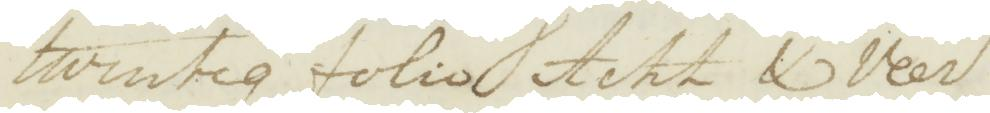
twintig folio Acht & Veer
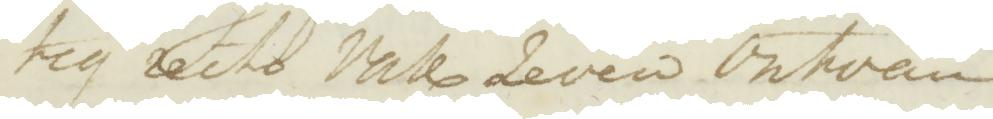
tig recto vak zeven ontvan
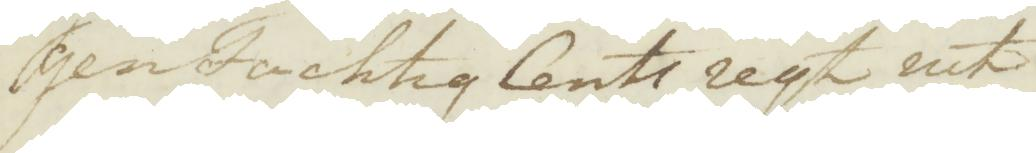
gen Tachtig Cents regt uit
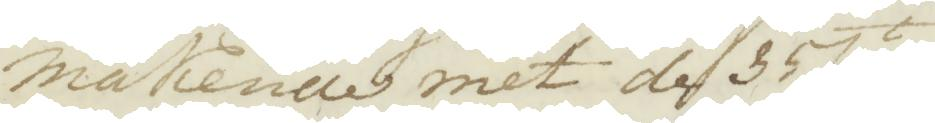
makende met de 35/c=t
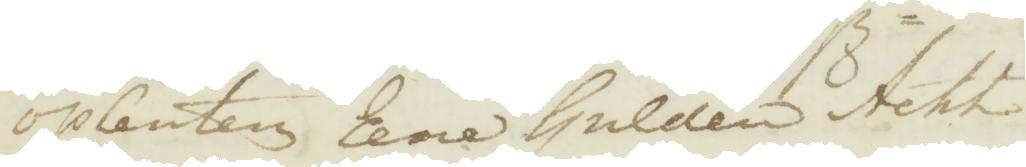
opcenten Eene Gulden Acht
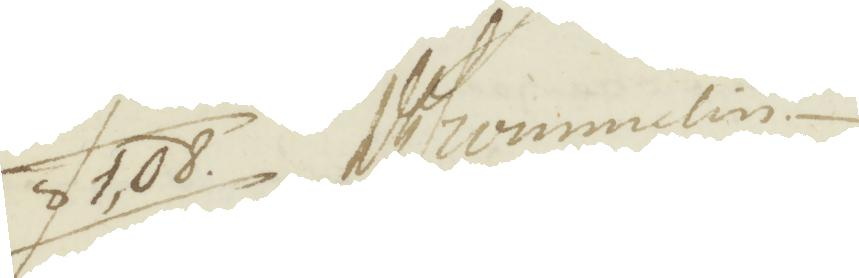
ƒ1,08. DF Crommelin.
